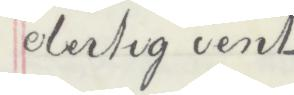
dertig cent
